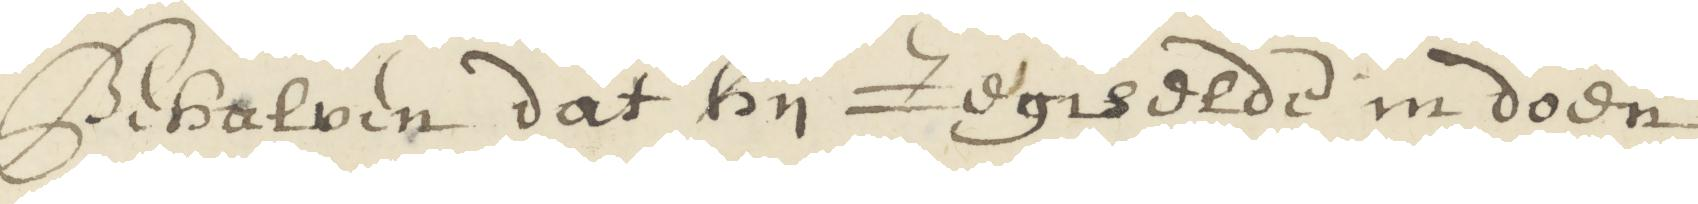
Behalven dat hij Gegiselde in doen
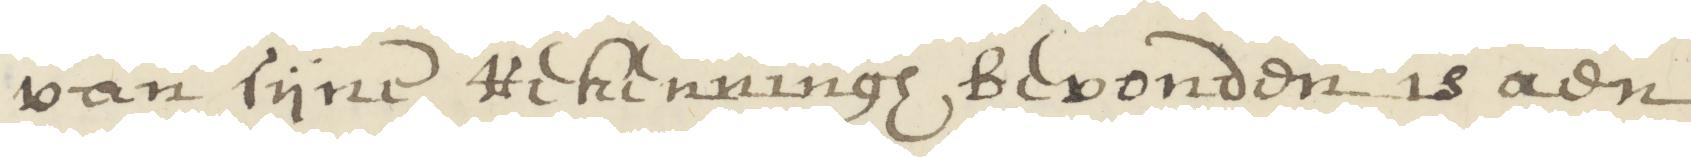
van sijne rekenningh bevonden is aen
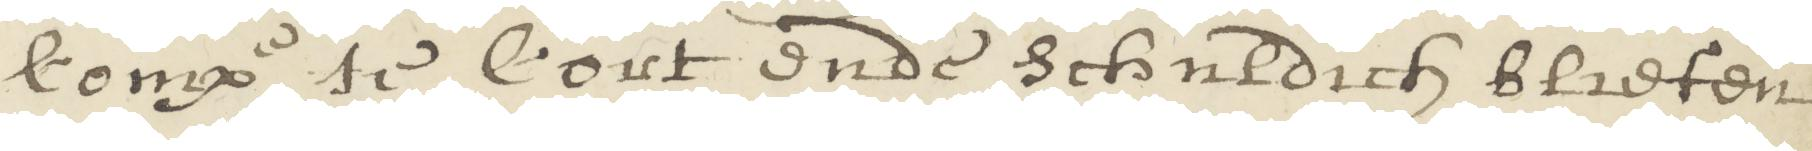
Compe te Cort ende schuldich bliefen
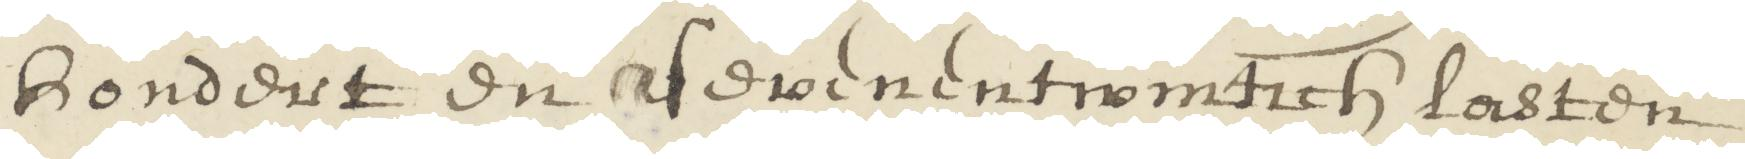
hondert en sevenentwintich lasten
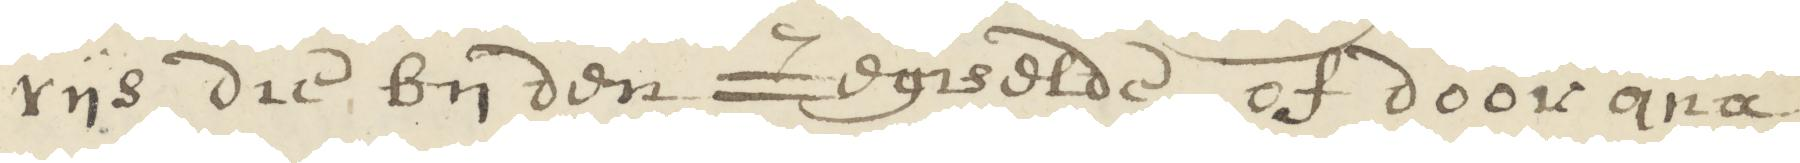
rijs die bij den Gegiselde of door qua„
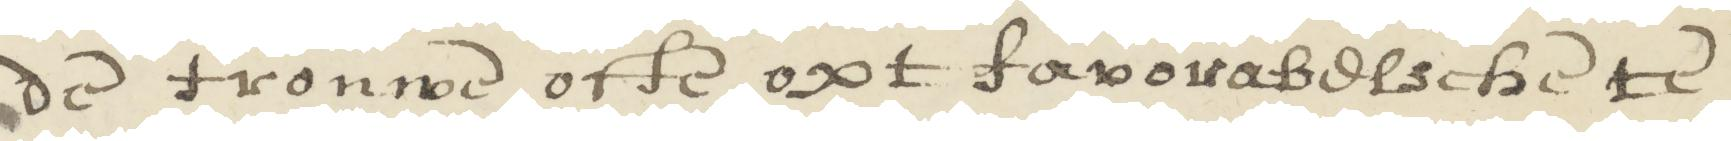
de trouwe ofte opt favorabelsche te
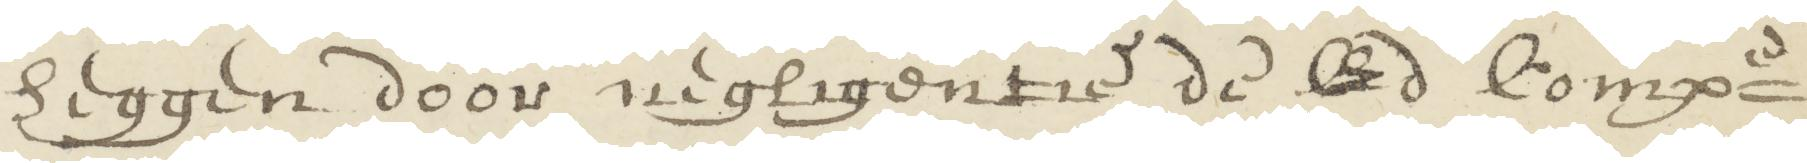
seggen door negligentie de Ed Comp=e
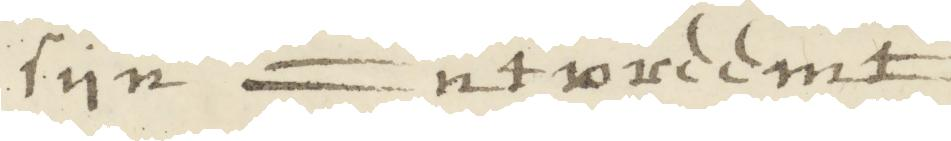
sijn Ontvreemt
